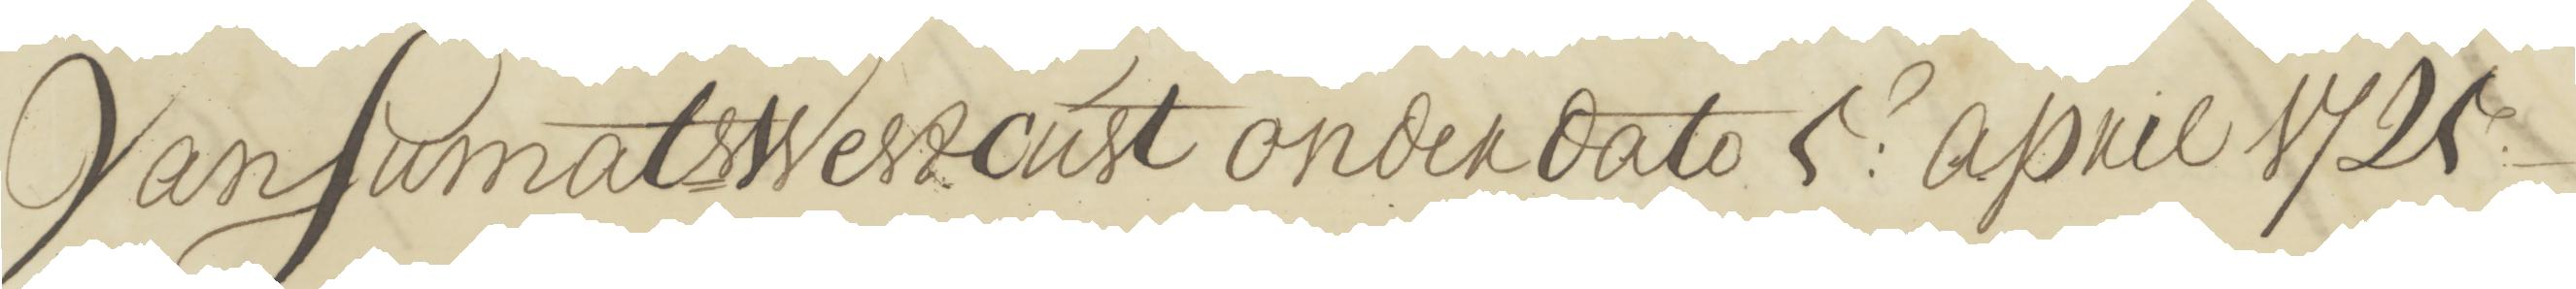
Van Sumat=sWestcust onder dato 5:' april 1725.
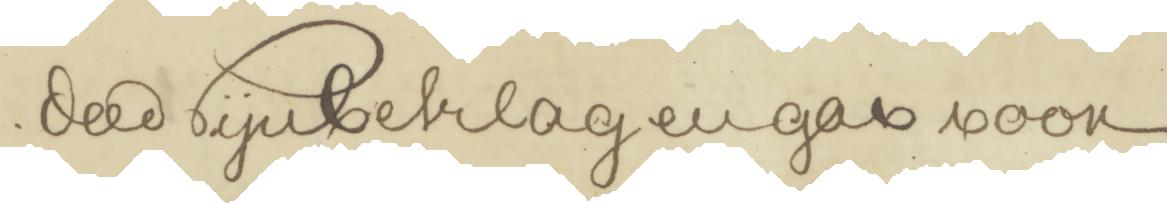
deed sijn beklag en gav voor
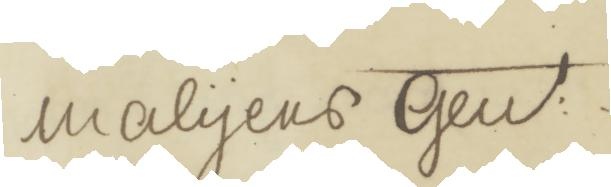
malijers gen:t . . . .
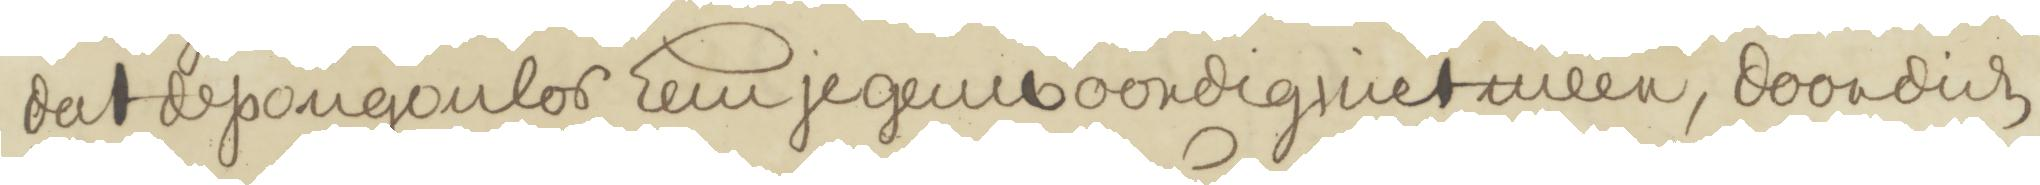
dat de pongonlos hem jegenwoordig niet meer, door dien
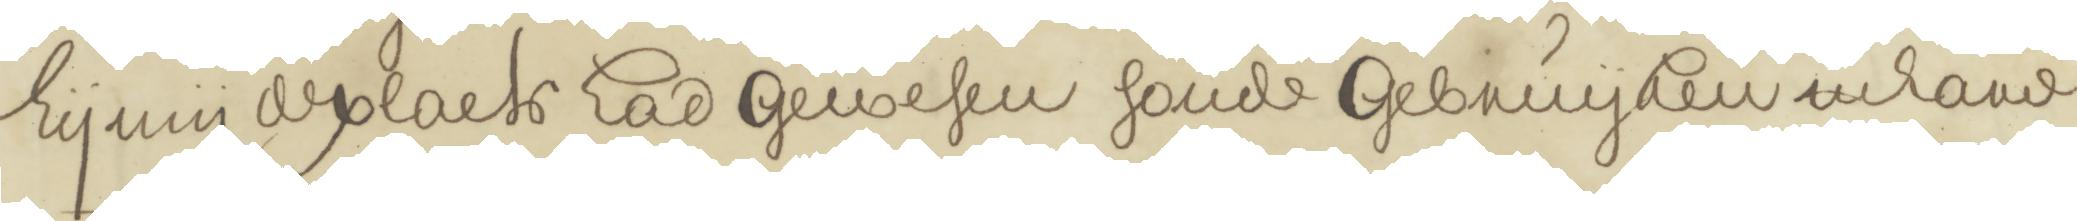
hij mij de plaets had gewesen soude gebruijken in hare
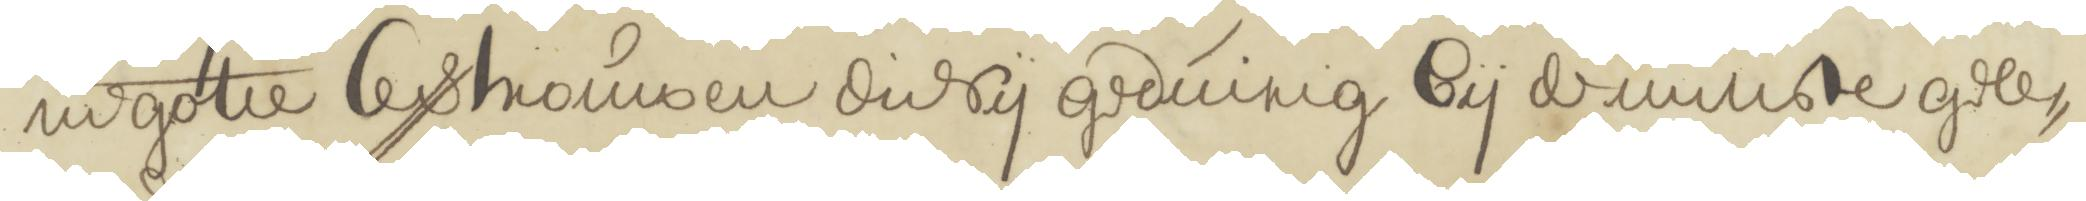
negotie tevertrouwen die sij geduirig bij de minste gele„
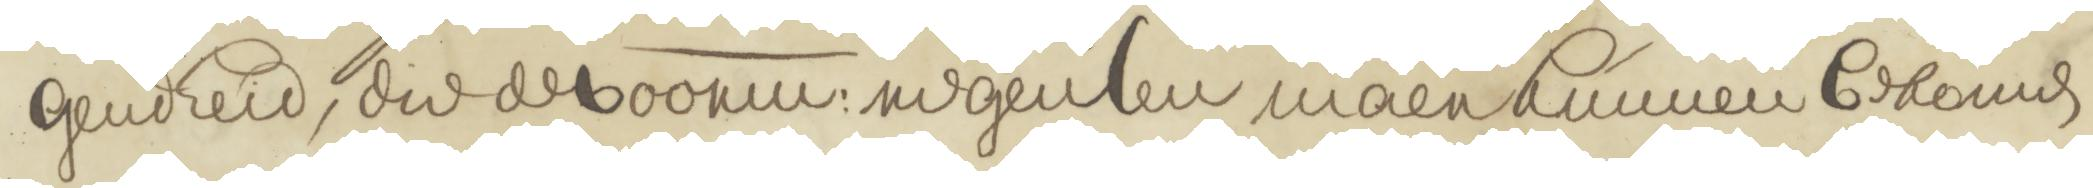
gendheid, die de voorm: regenten maer kunnen bekomen
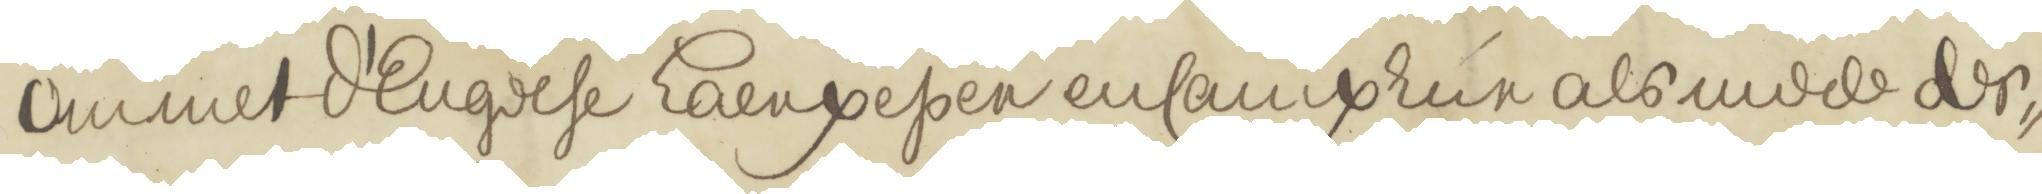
om met d'Engelse haer peper en camphur als mede des„
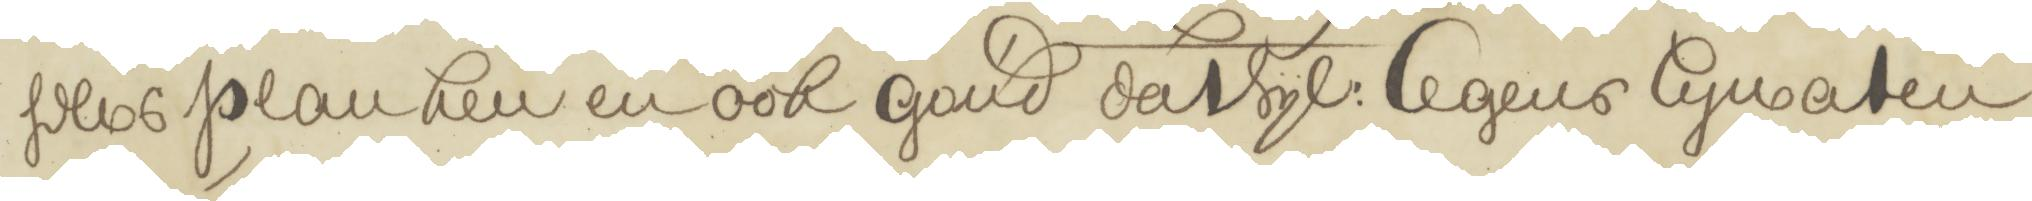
selvs planken en ook goud datsijl: tegens lywaten
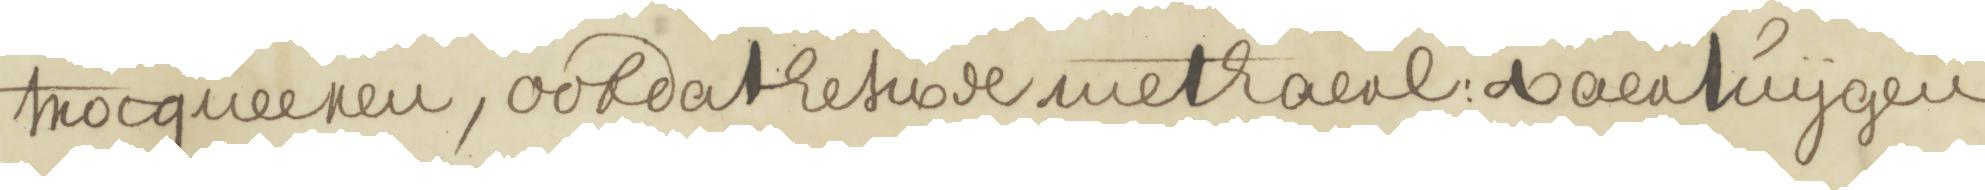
trocqueeren, ook dat hetwel met haerl: vaertuijgen
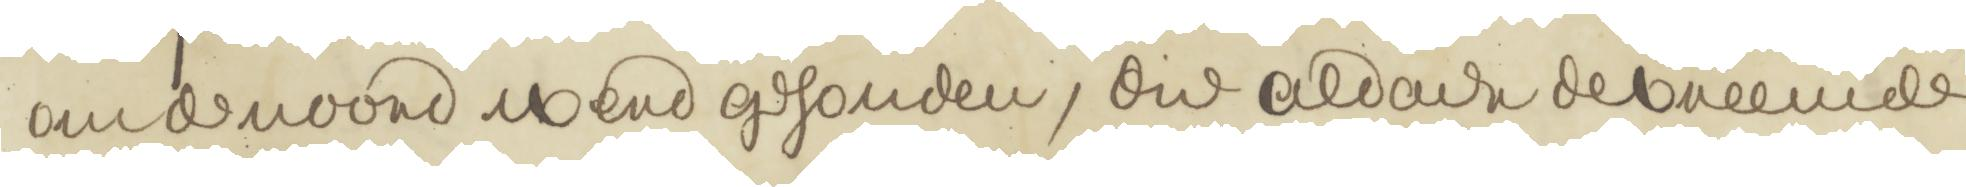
om de noord werd gesonden, die aldaer de vreemde
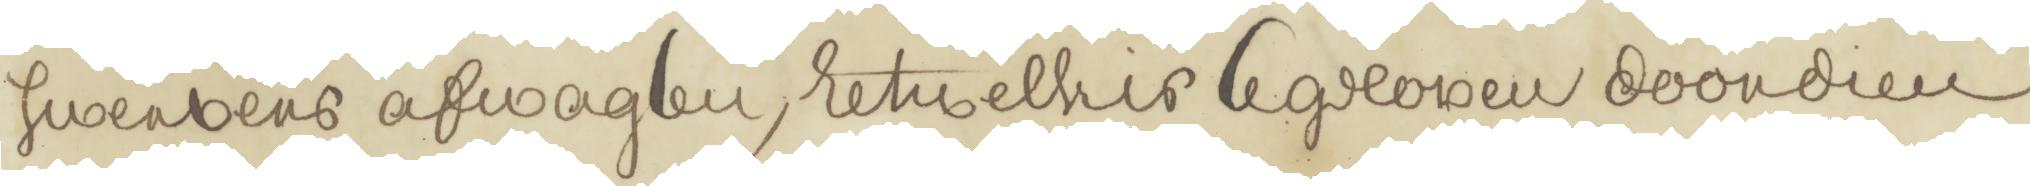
swervers afwagten, het welk is te geloven door dien
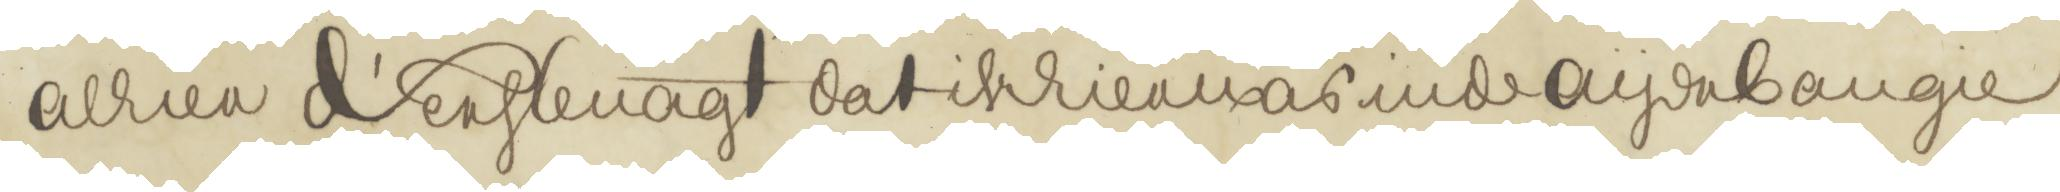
alhier d'Eerste nagt dat ik hier was inde aijerbangie
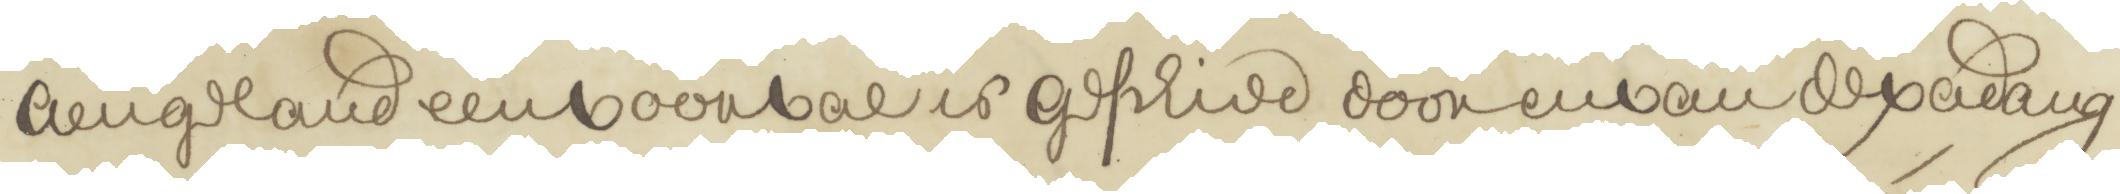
aengeland een voorval is geschied door en van de padang
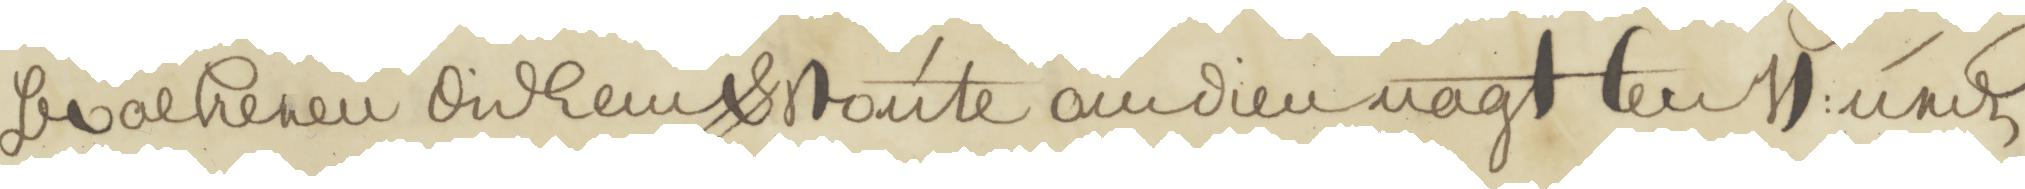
se volkeren die hem verstoute om dien nagt ten 11. uren
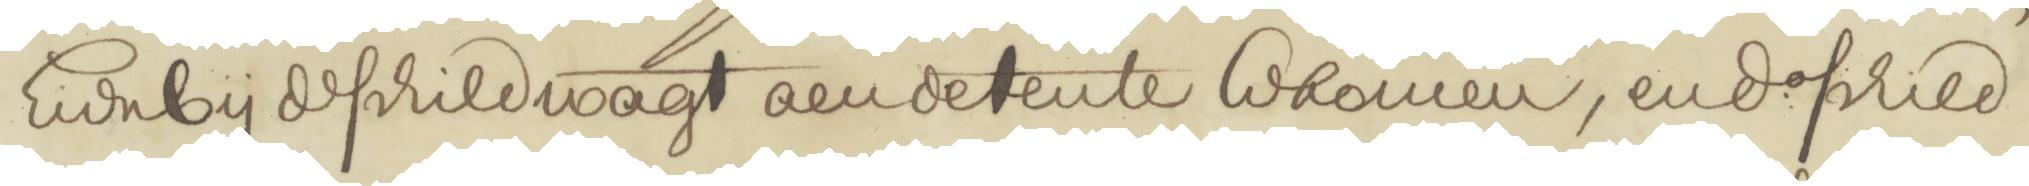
hierbij de schildwagt aen de tente tekomen, en d:o schild
